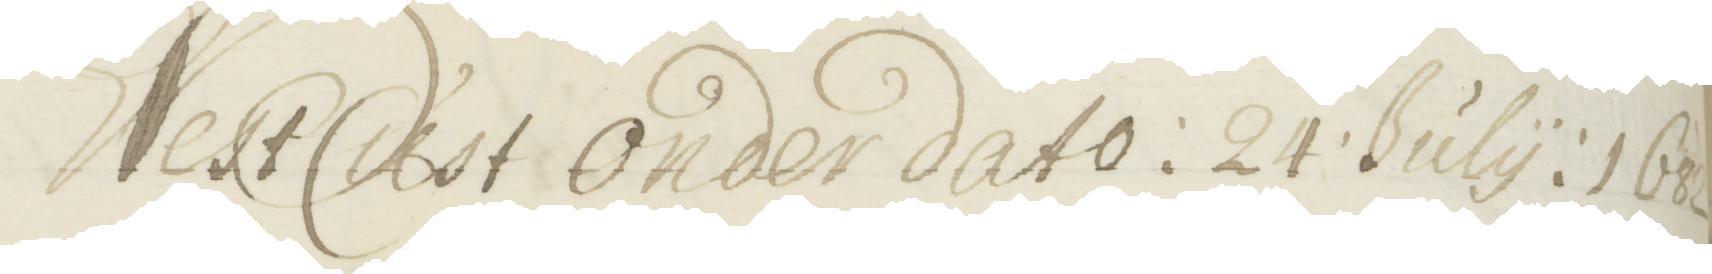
Van Sumatras West Cust onder dato: 24' Julij: 1682
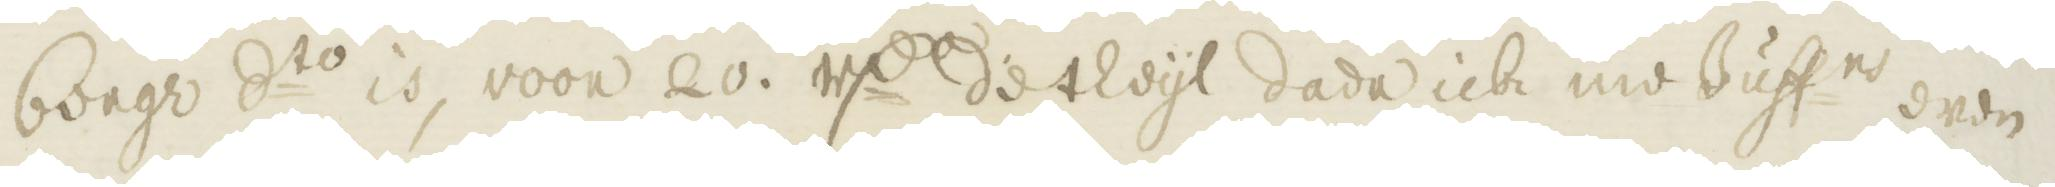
Bergh d=to is, voor 20. w=el d'etheijl daer ick uw Juff=rs eren
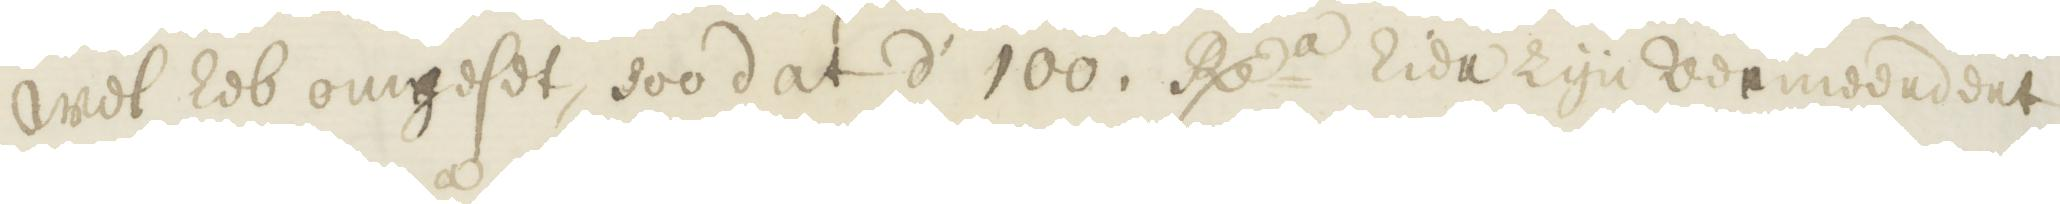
wel heb omgeset, soo dat d’ 100. Rd=a hier zijn vermeerdert
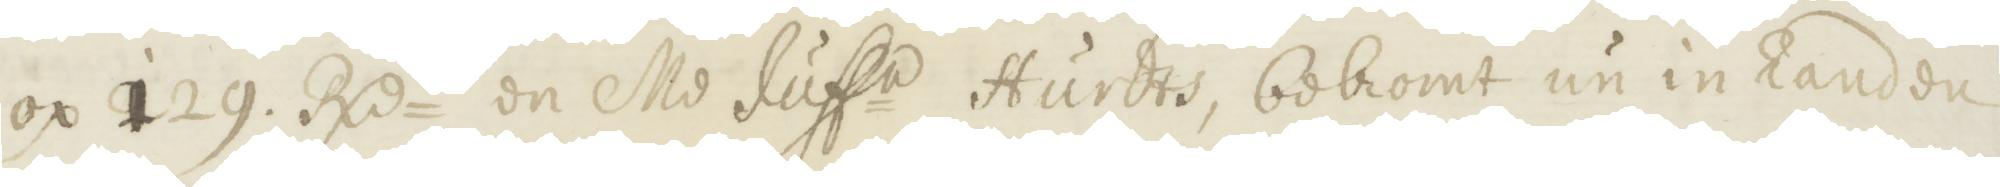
op 129. Rd=a en Me Juff=r Hurets, bekomt nu in handen
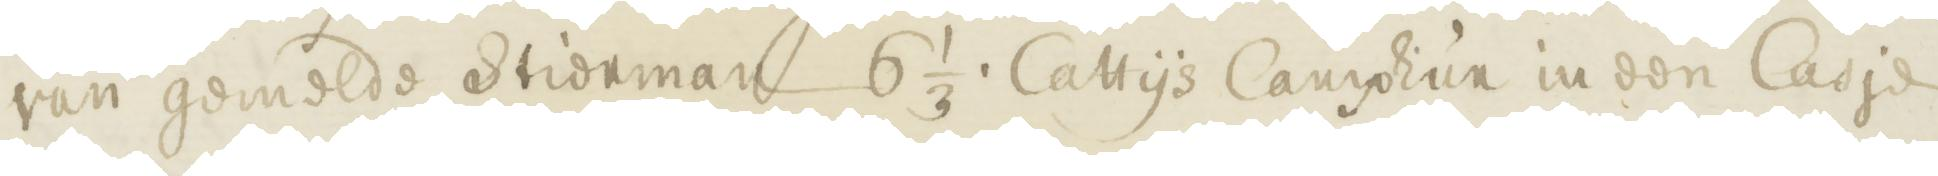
van gemelde stierman 6 1/3 Cattijs Camphur in een Casje
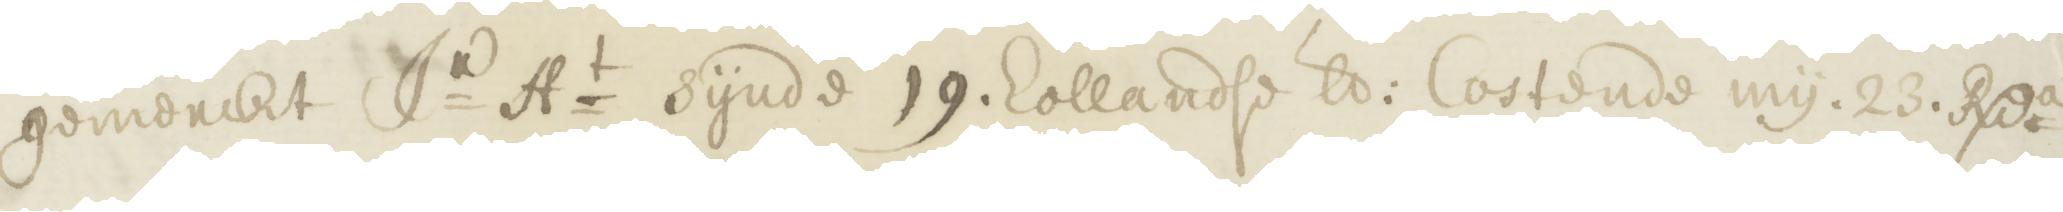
gemerckt J=r H=t sijnde 19. Hollandse lb: Costende mij .23. Rd=a
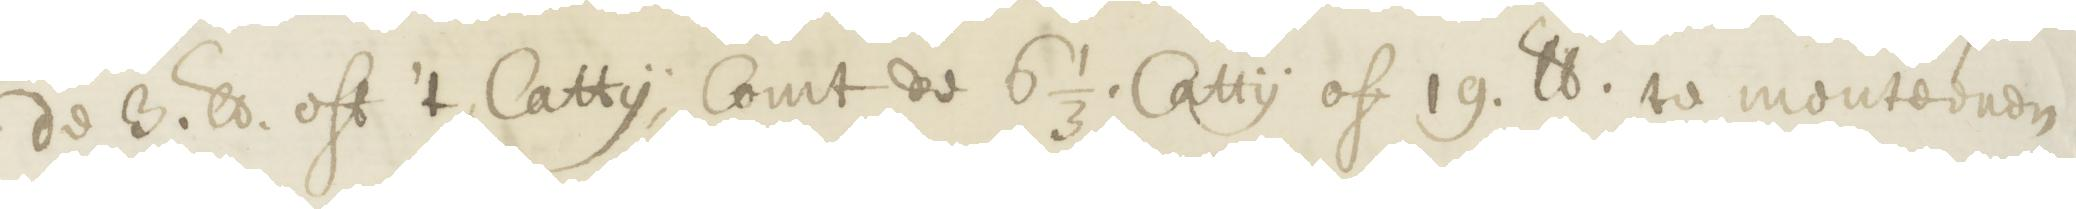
de 3. lb. oft ’t Cattij, comt de 6 1/3. Cattij of 19. lb. te monteeren
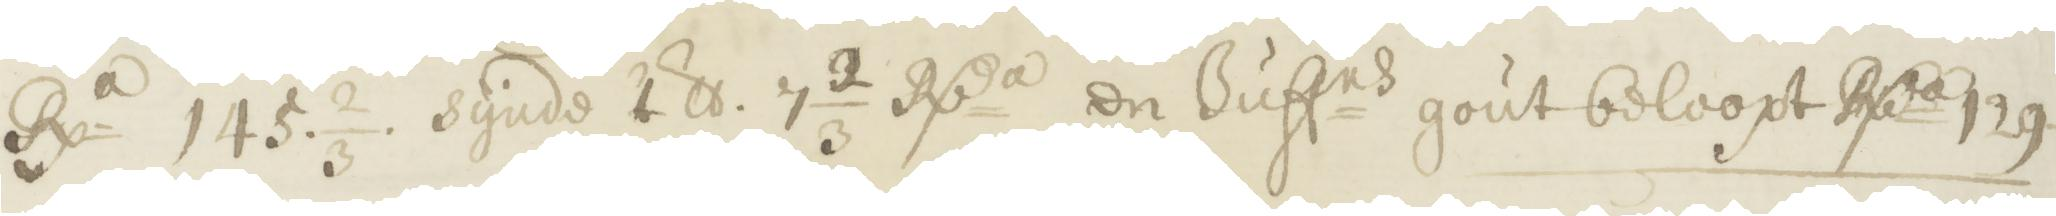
R=a 145. 2/3. sijnde 't lb. 7 2/3 R=da en Juff=ren gout beloopt Rd=a 129
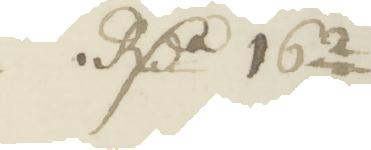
. Rda 16 2/
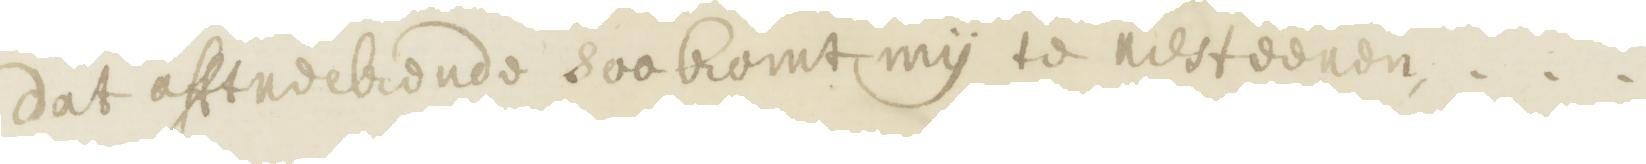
dat afftreckende soo komt mij te resteeren, . . .
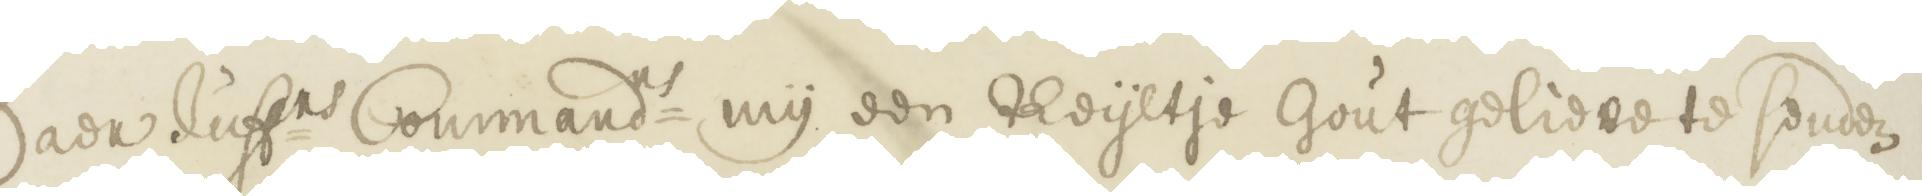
Daer Juff=rs Command=rs mij een theijltje gout gelieve te senden
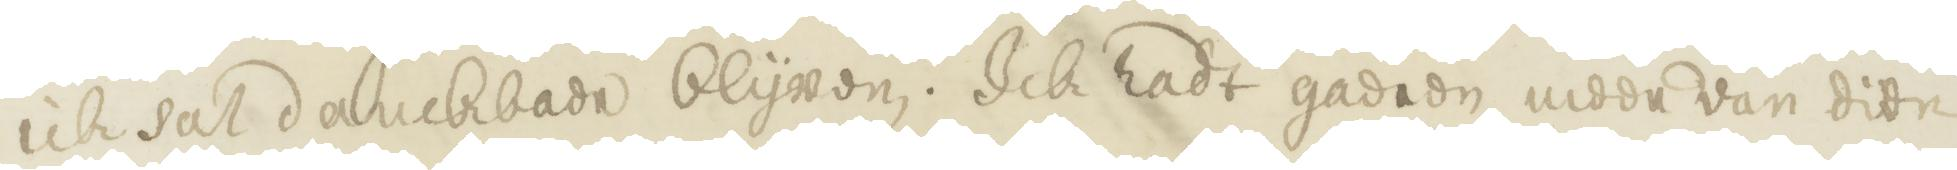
ick sal danckbaer blijven, . Ick hadt gaeren meer van dien
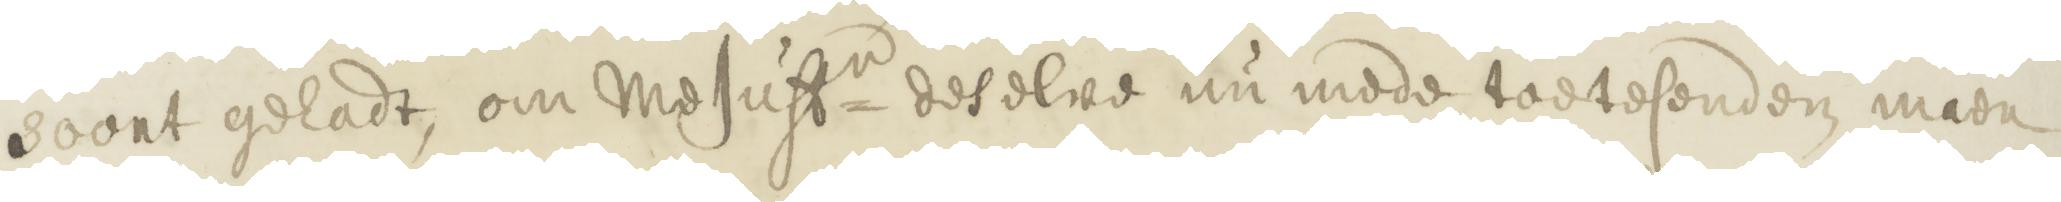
soort gehadt, om Me Juff=r deselve nu mede toetesenden maer,
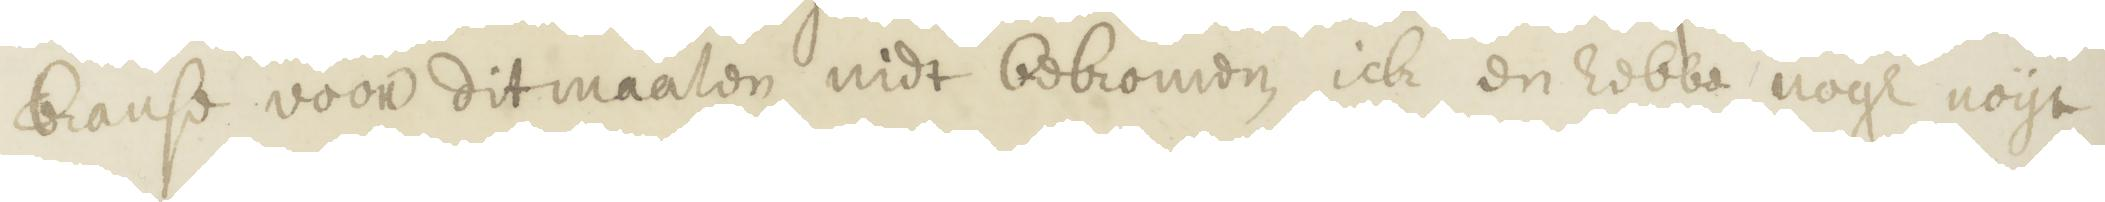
kanse voor ditmaalen niet bekomen, ick en hebbe nogh noijt
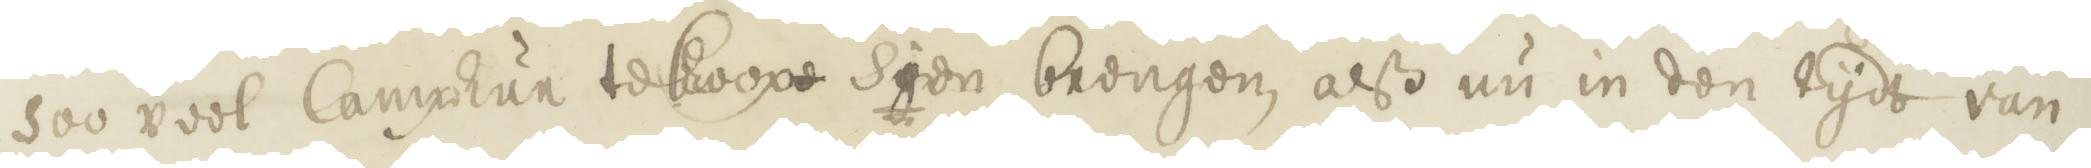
soo veel Camphur te koope sijen brengen, als nu in den tijdt van
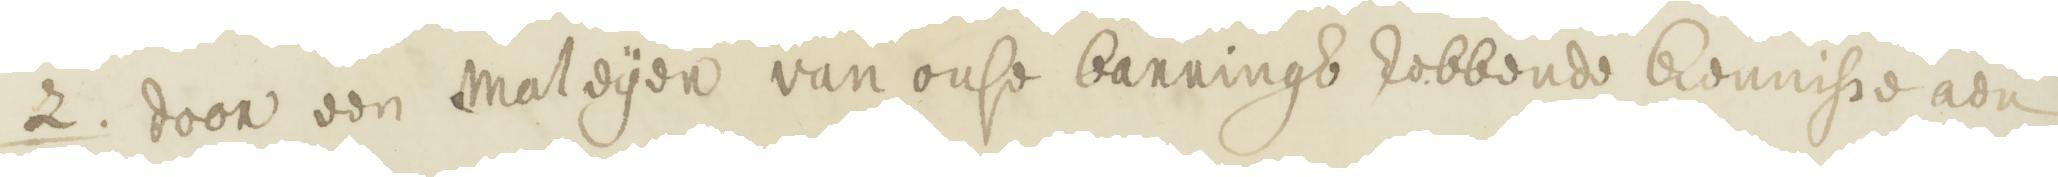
z/. door een maleijer van onse barringh hebbende kennise aen
